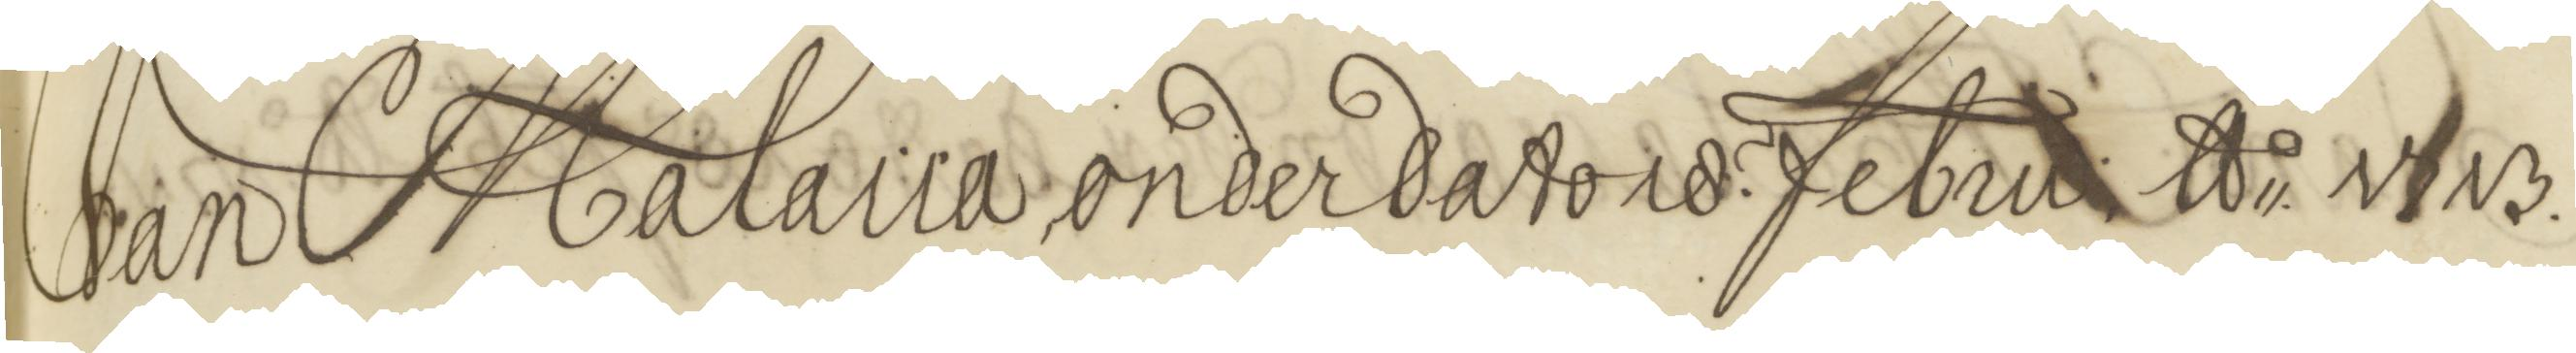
Van Malacca onder dato 18:' febru: A„o 1713.
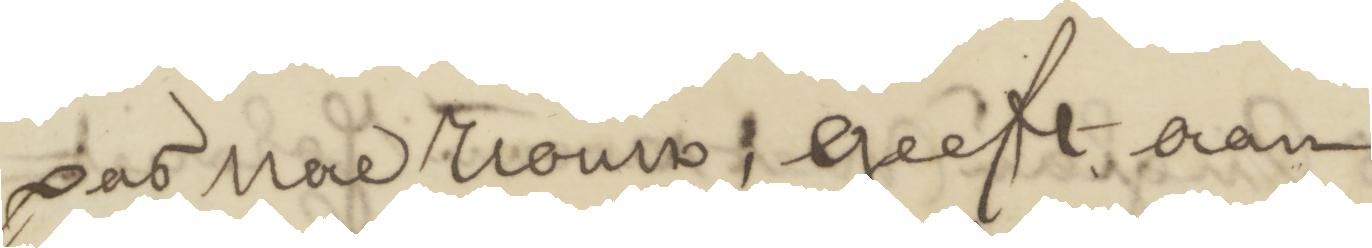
pas nae Riouw: geeft, aan
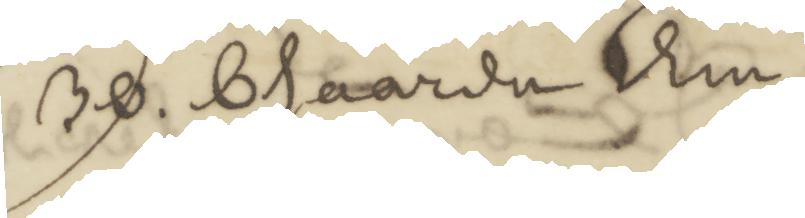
30. bhaaren thin
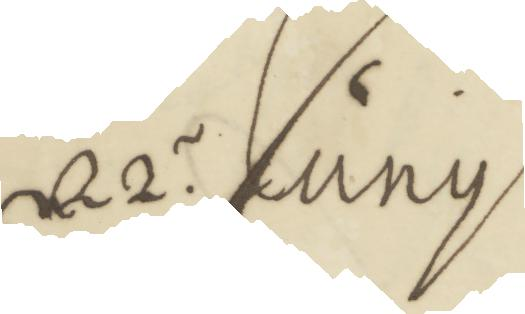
22:' Junij
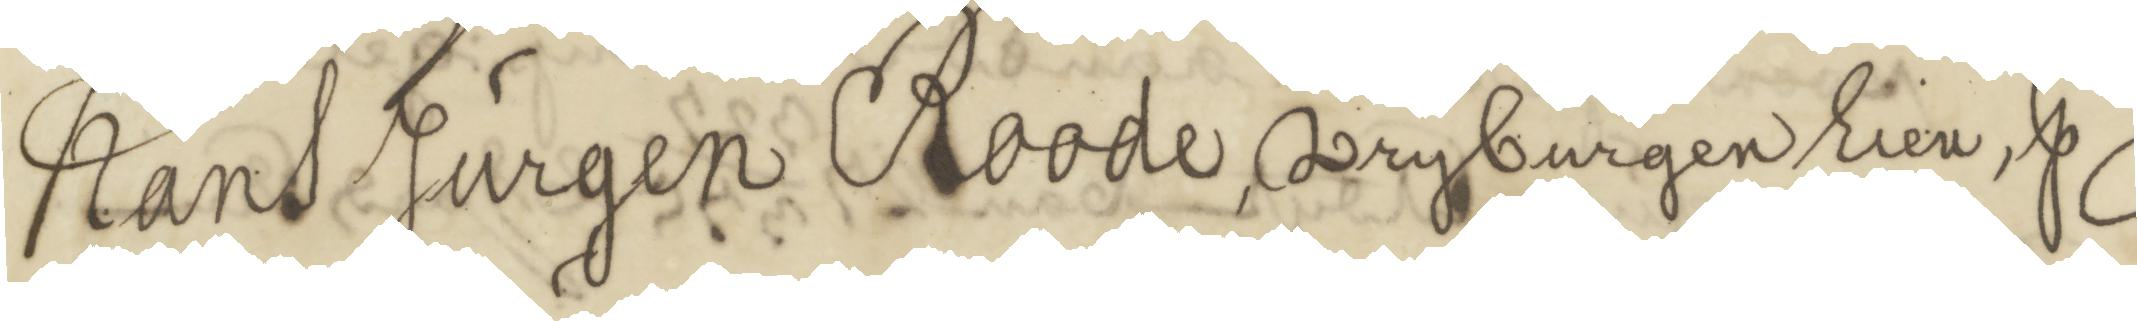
Hans Jurgen Roode, vrijburger hier, p:r
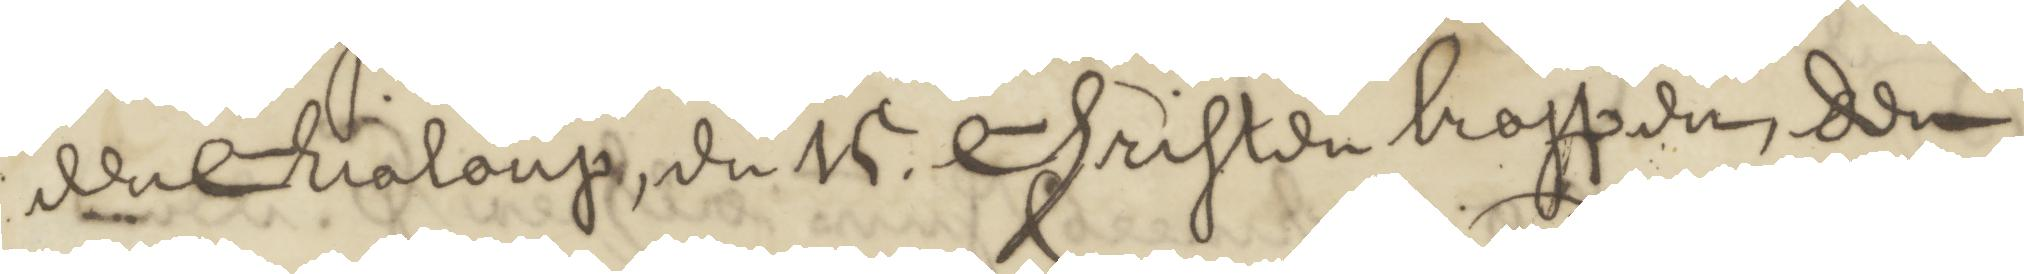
een Chialoup, en 15. Christen koppen, den
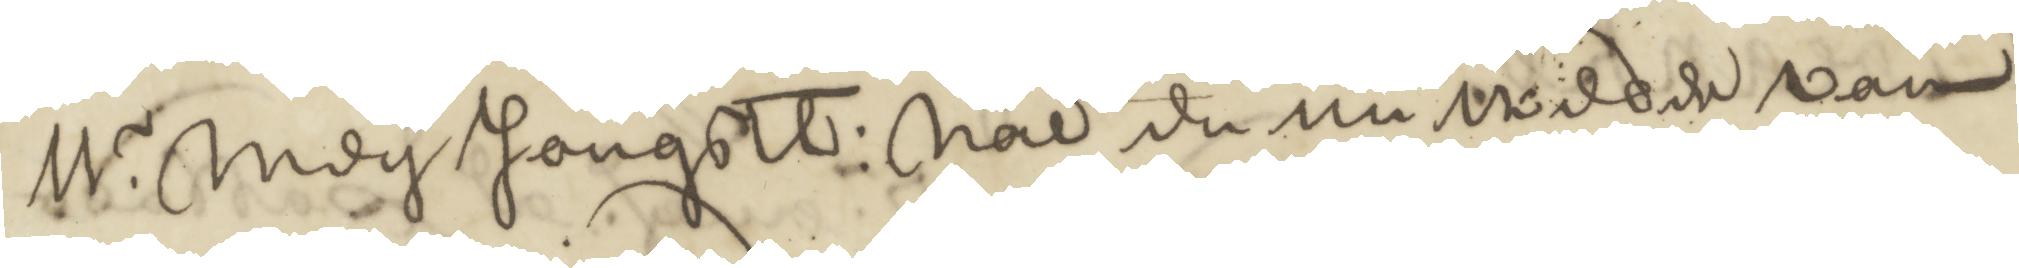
11:e Meij Jongstl: nae en nu weder van
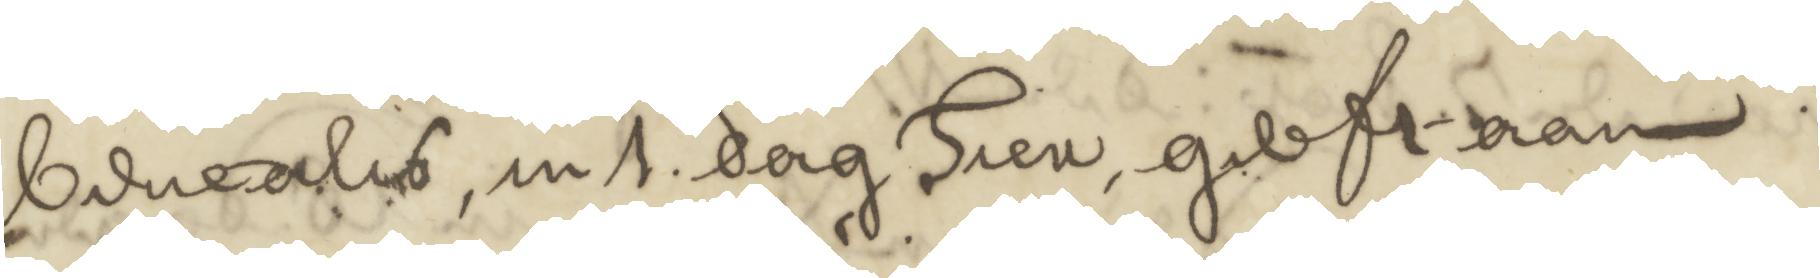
bencalis, in 1. dag hier, geeft aan.
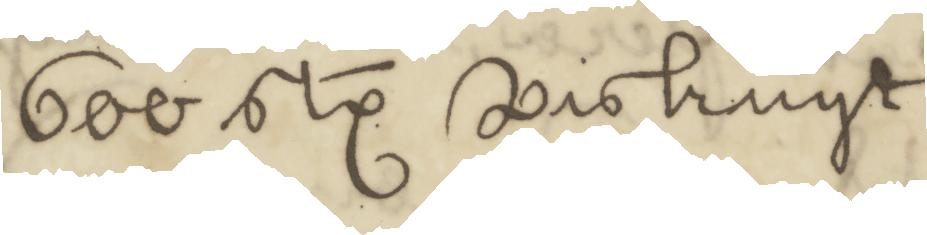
600 stx viskuijt
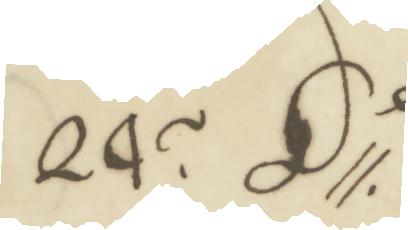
24.' D„o
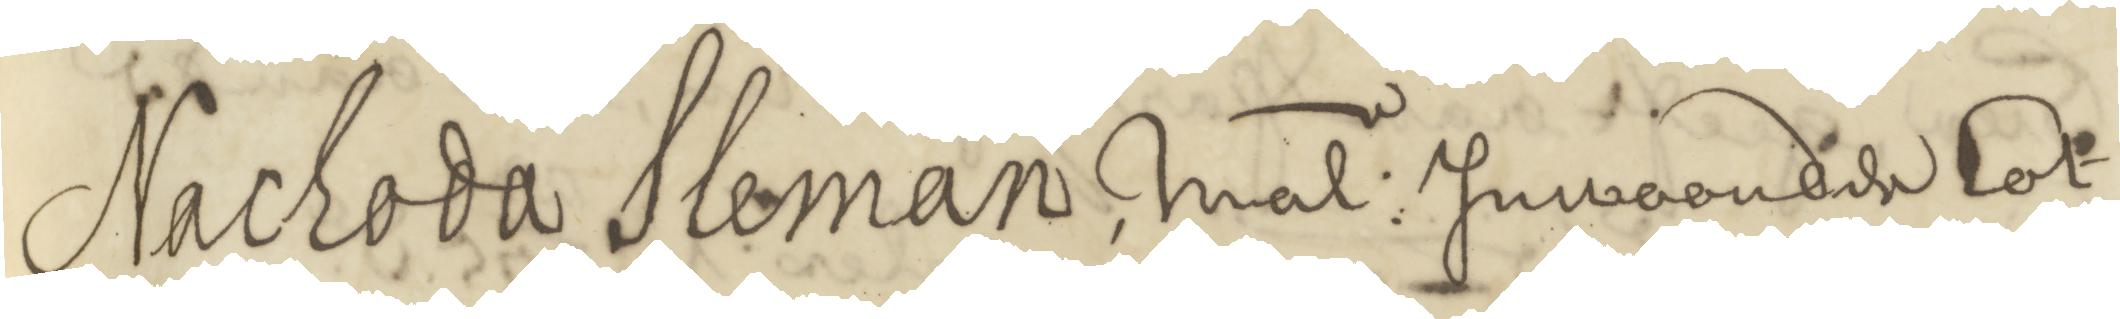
Nachoda Sleman, mal:e Jnwoonder tot
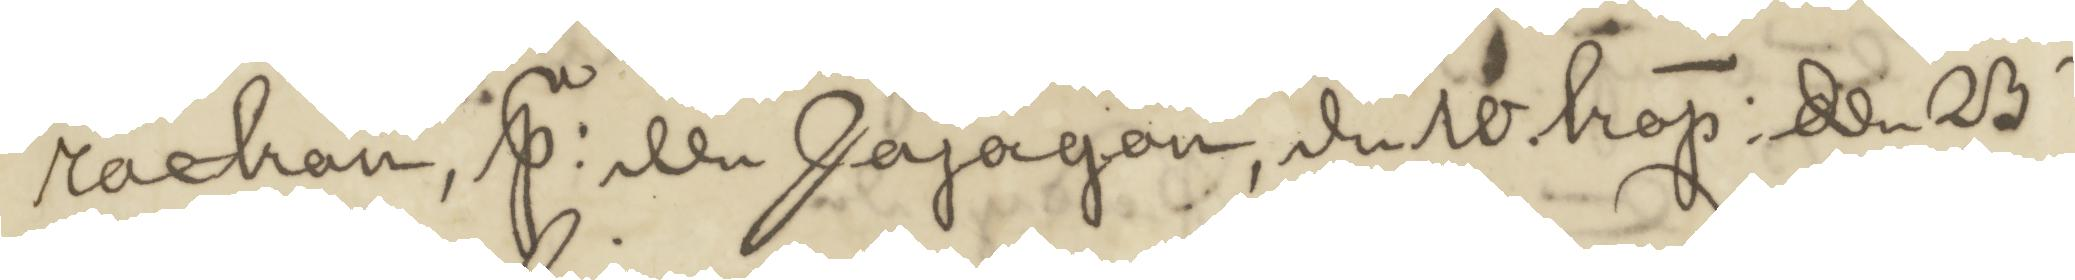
rackan, p:r een Jajagon, en 10. kop: den 23:'
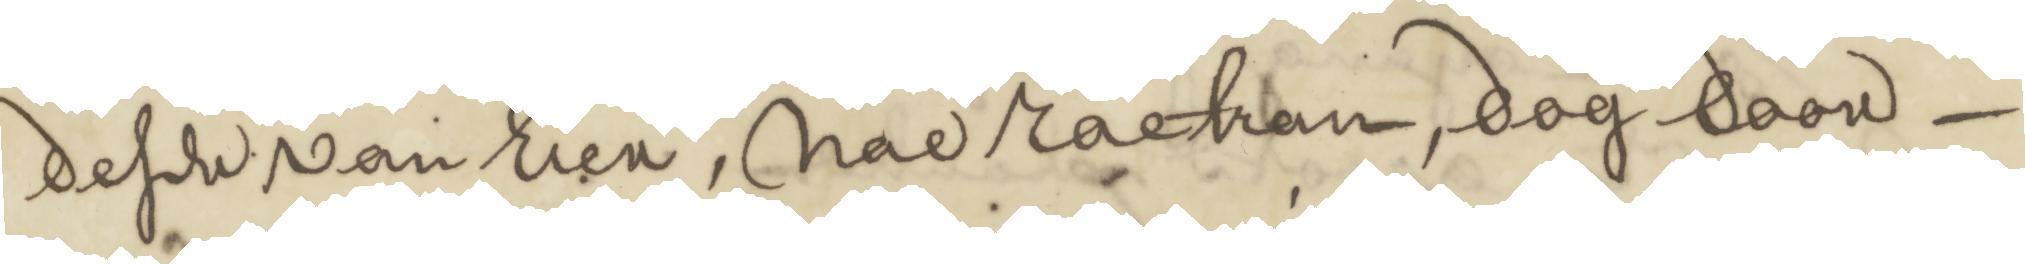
deser van hier, nae rackan, dog door —
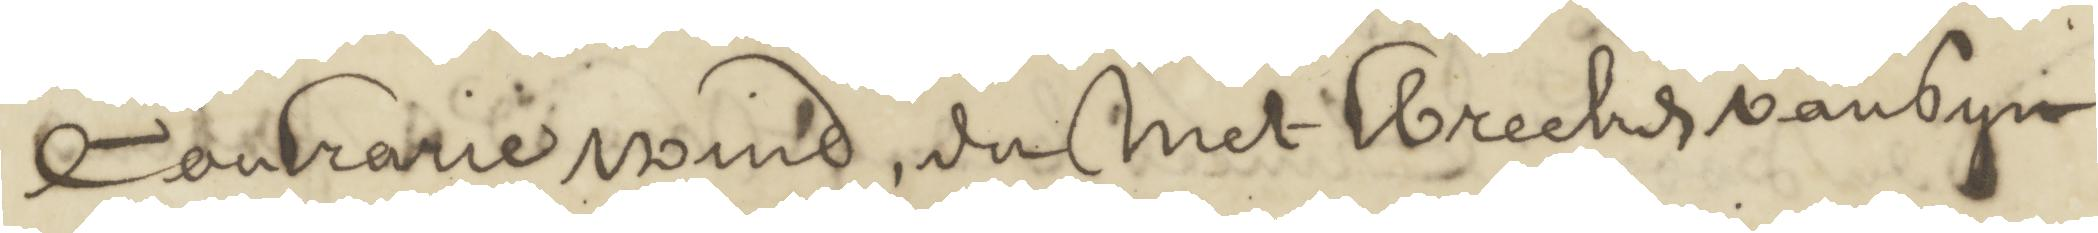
Contrarie wind, en met 't breeken van syn
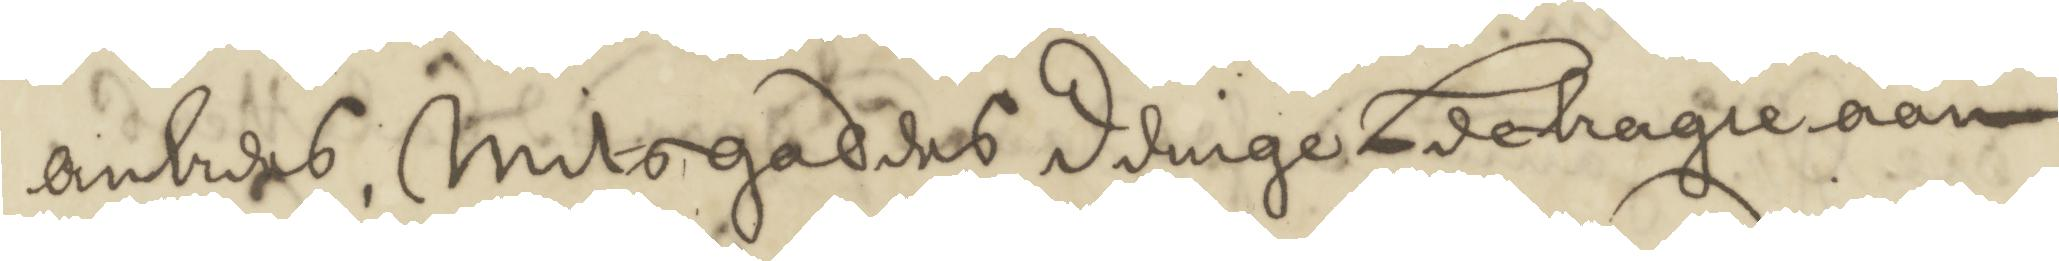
ankers, mitsgaders Eenige Leckagie aan
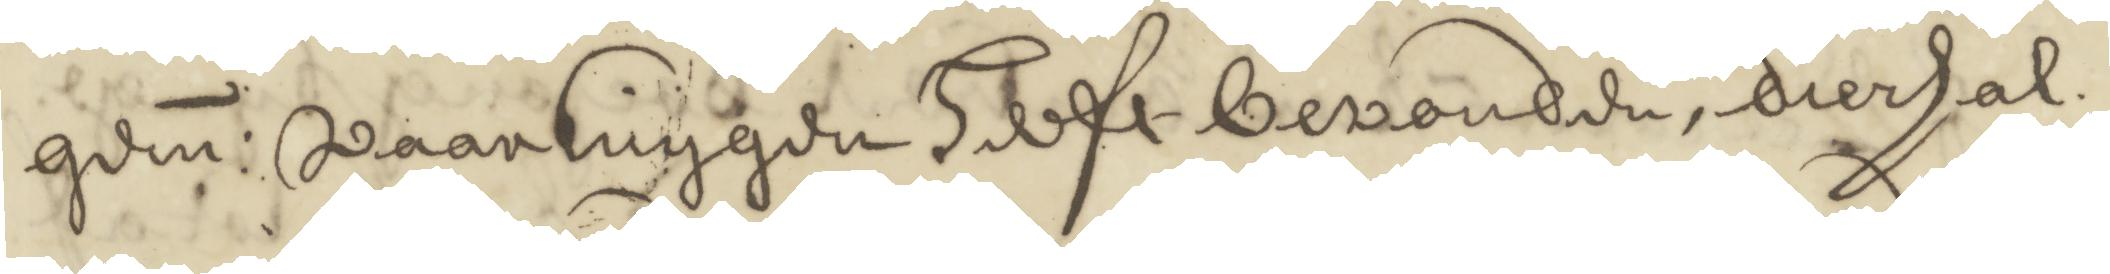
gem: vaartuijgen heeft bevonden, dierhal.
